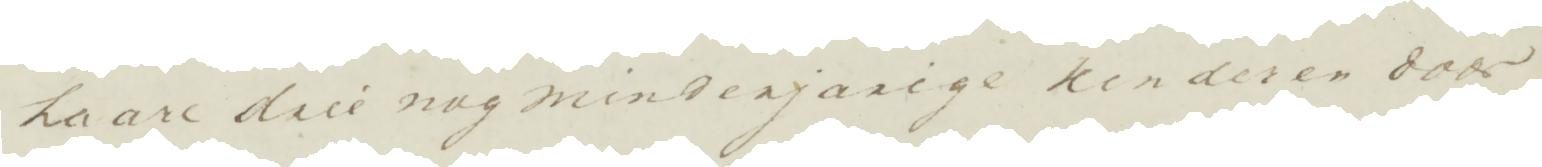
haare drie nog minderjarige kinderen door
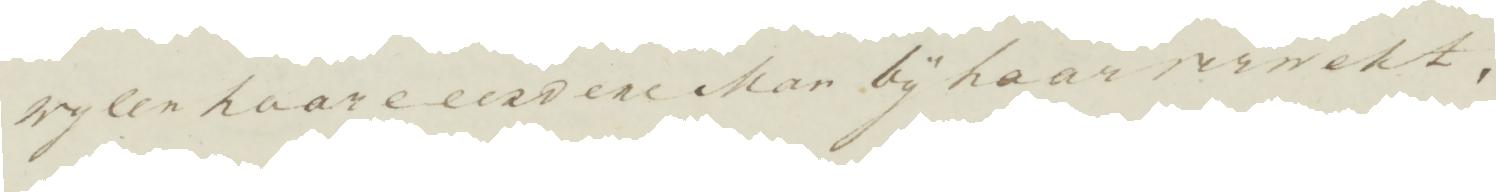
wijlen haare eerdere Man bij haar verwekt,
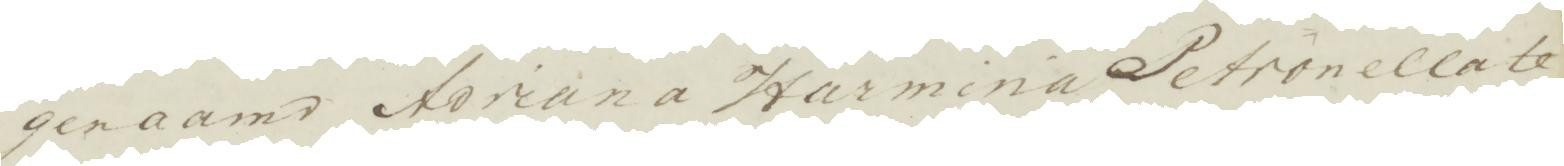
genaamd Adriana Harmina Petronella te
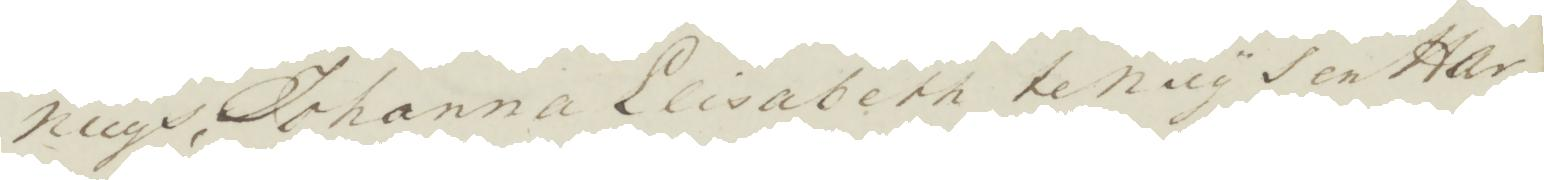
nuijs, Johanna Elisabeth te nuijsen Har
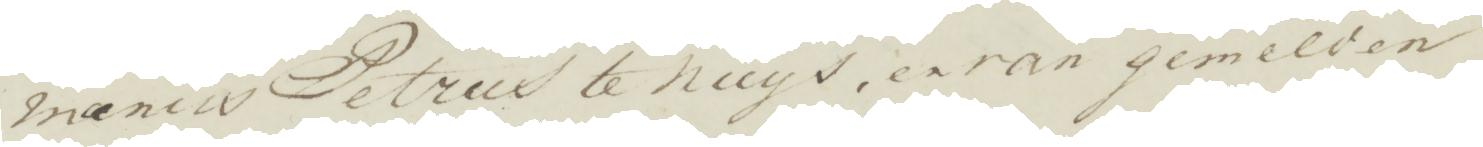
manus Petrus te nuijs, en van gemelden
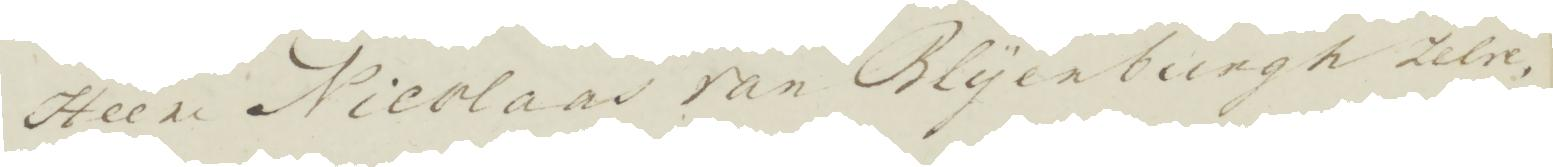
Heere Nicolaas van Blijenburgh zelve,
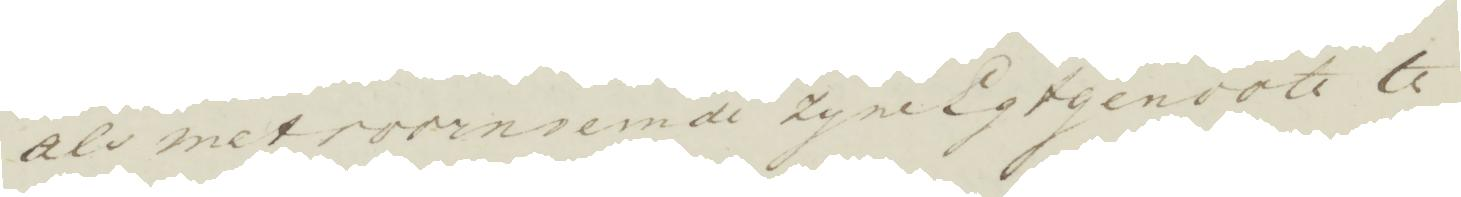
als met voornoemde zijne Egtgenoote te
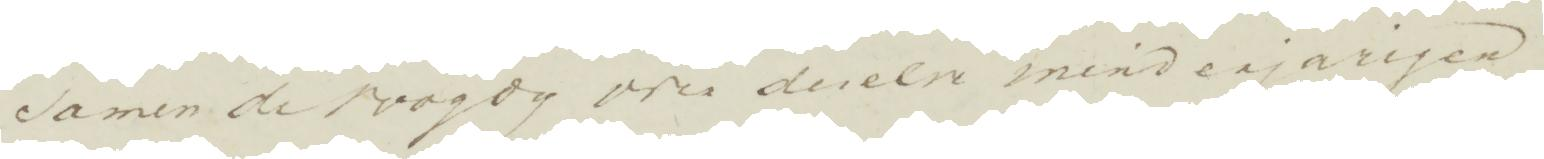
samen de voogdij over deselve minderjarigen
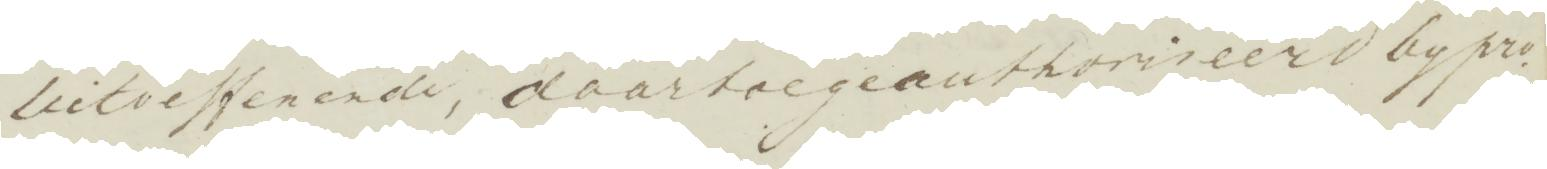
uitoeffenende, daar toe geauthoriseerd by pro
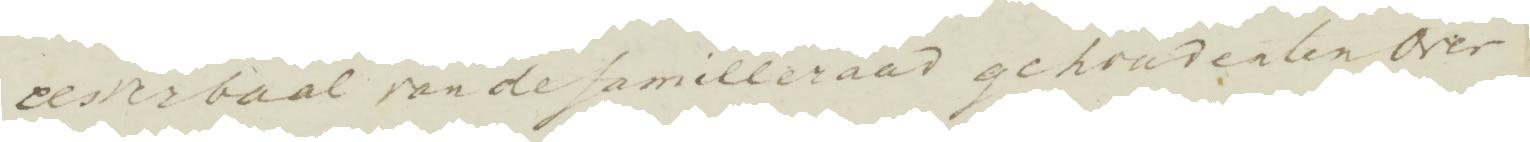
cesverbaal van de familleraad gehouden ten over
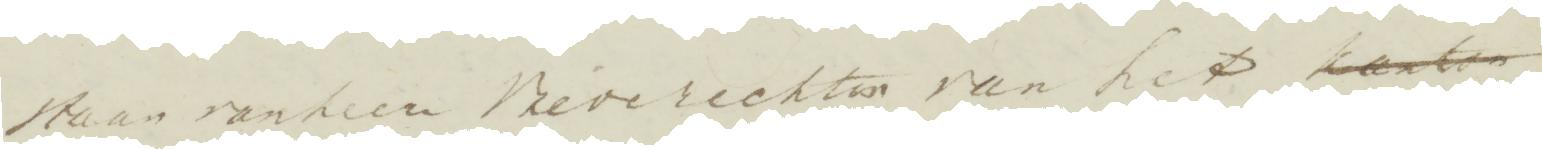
staan van heere Vrederechten van het kanton
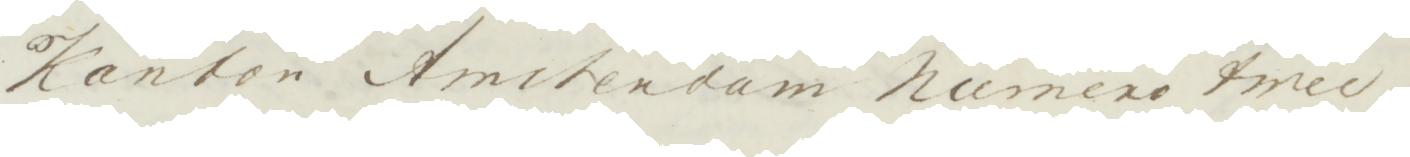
Kanton Amsterdam numero twee,
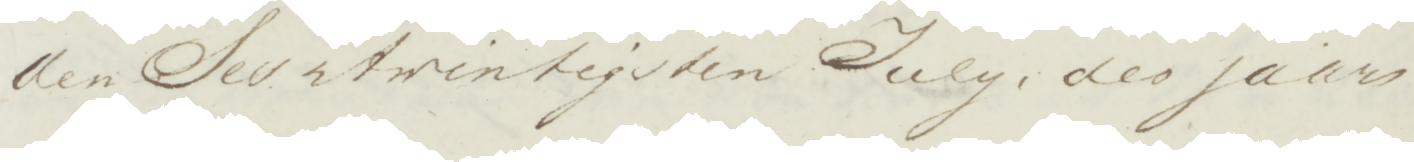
den sesentwintigsten July, des jaars
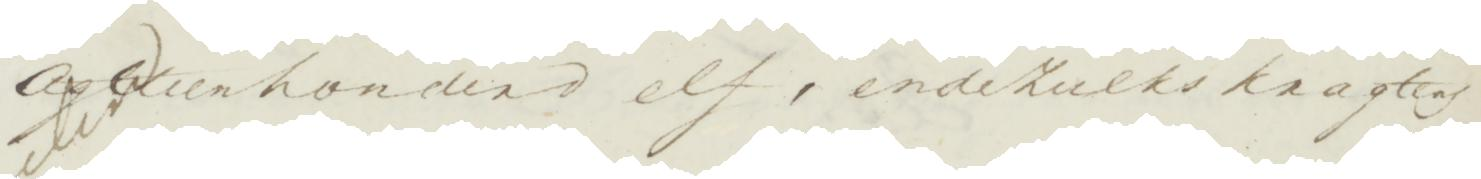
agttienhonderd elf, ende zulks kragtens
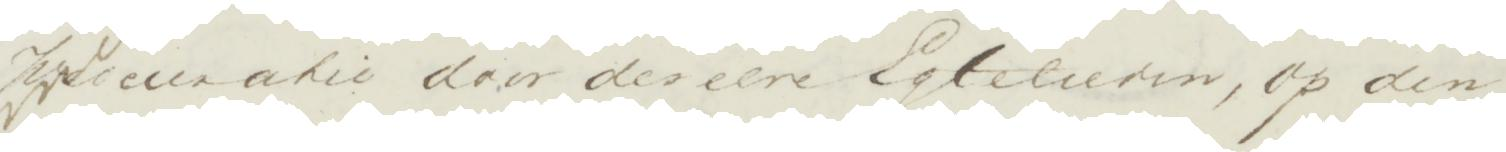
procuratie door deselve Egtelieden, op den
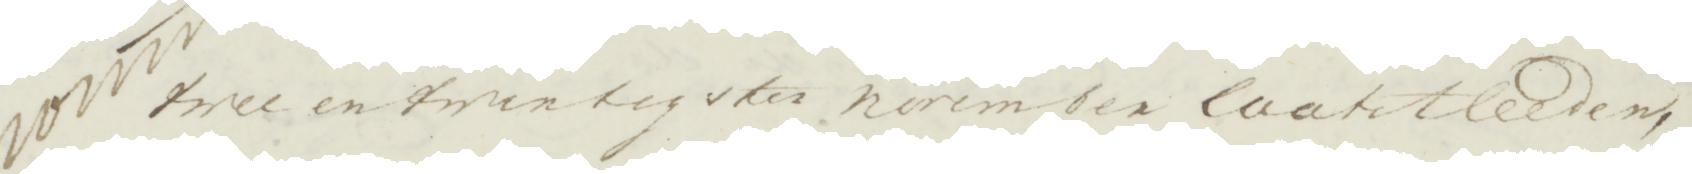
twee en twintigster november laatstleeden,
